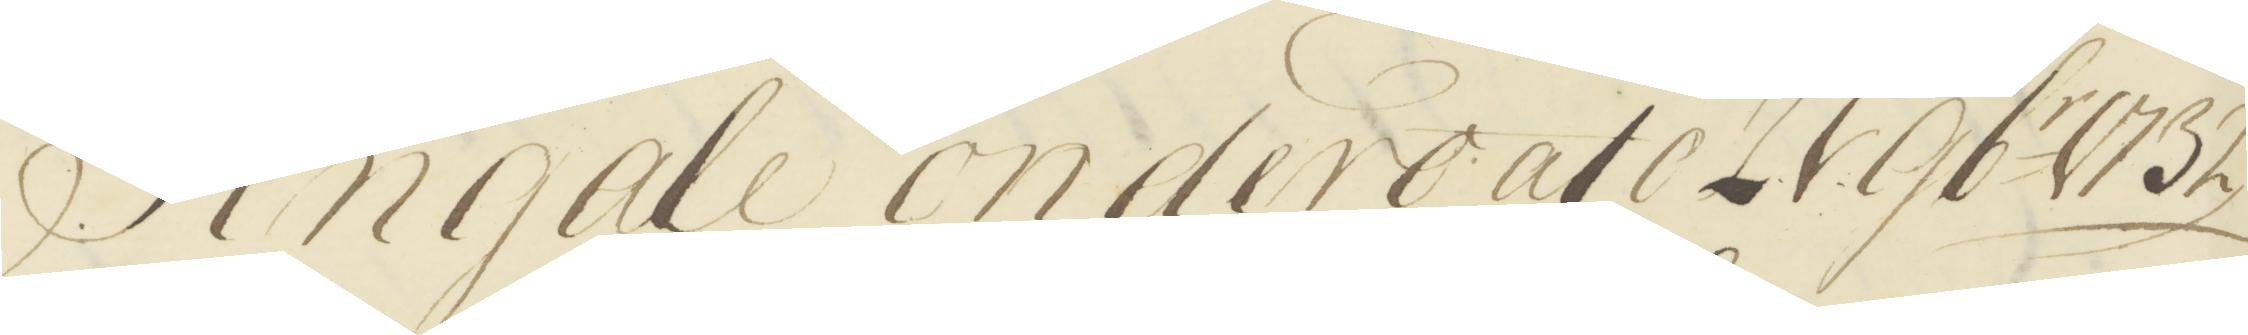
Van Bengale onder dato 21: 9b:r 1732
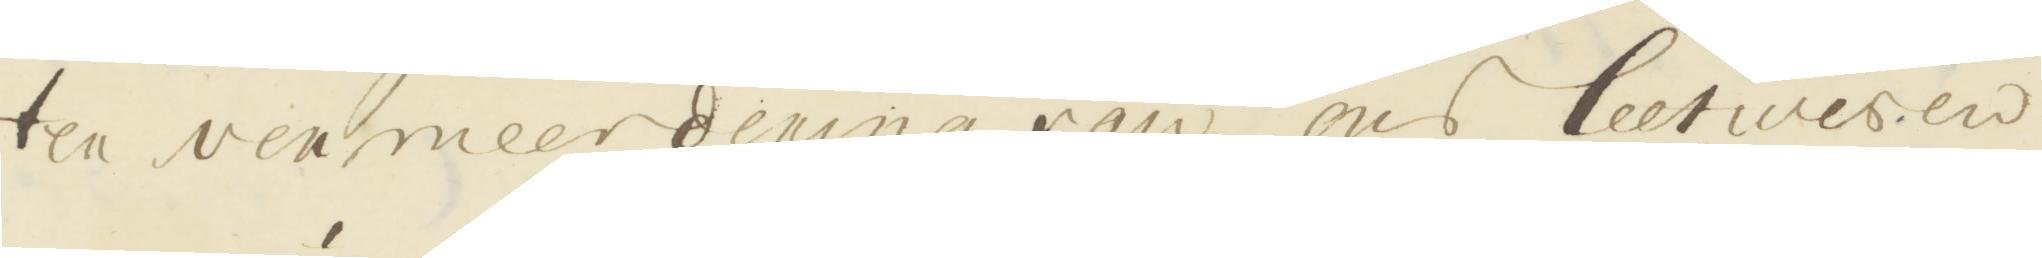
ter vermeerdering van ons leetwesen
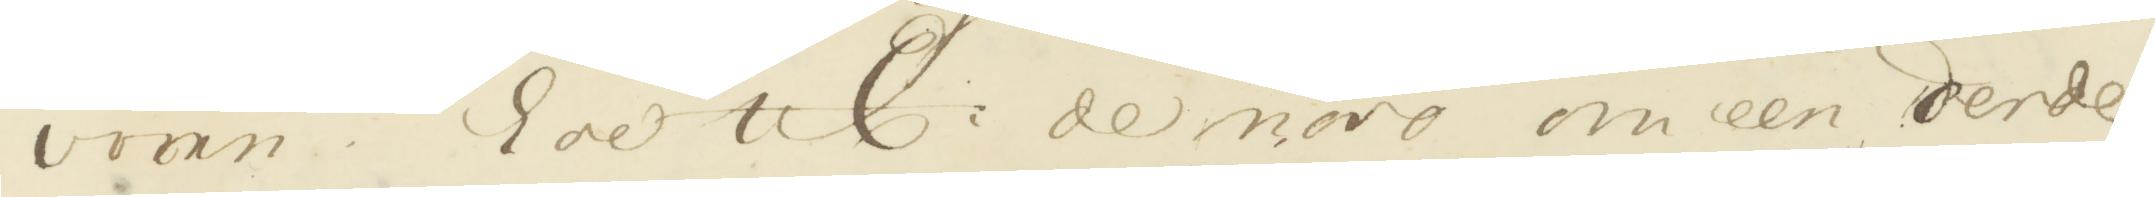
voorn:t hoe uE: de novo om een derde
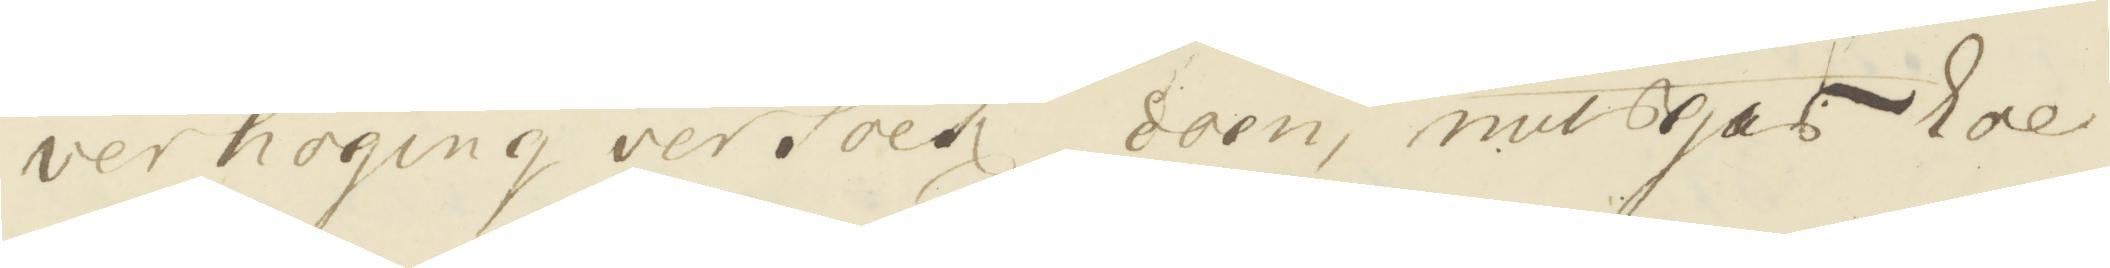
verhoging versoek doen, mitsgrs hoe
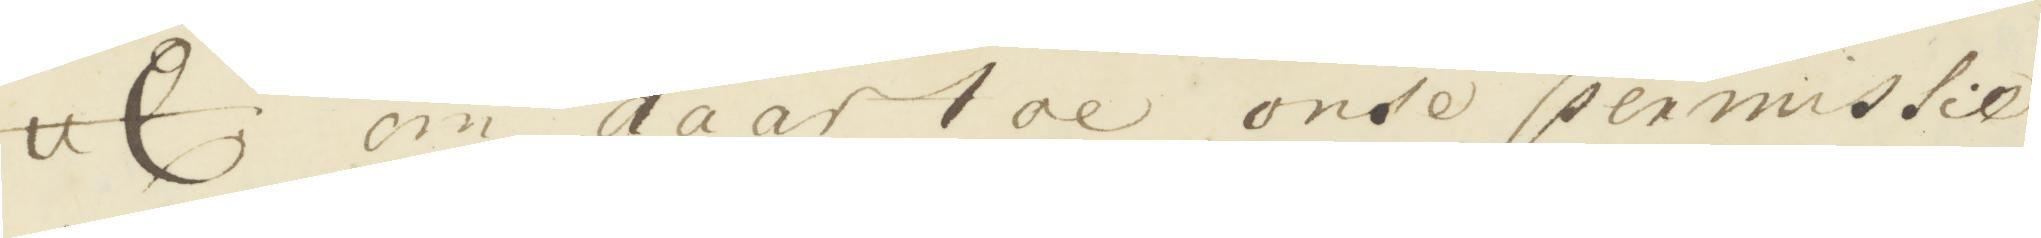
uE om daar toe onse permissie
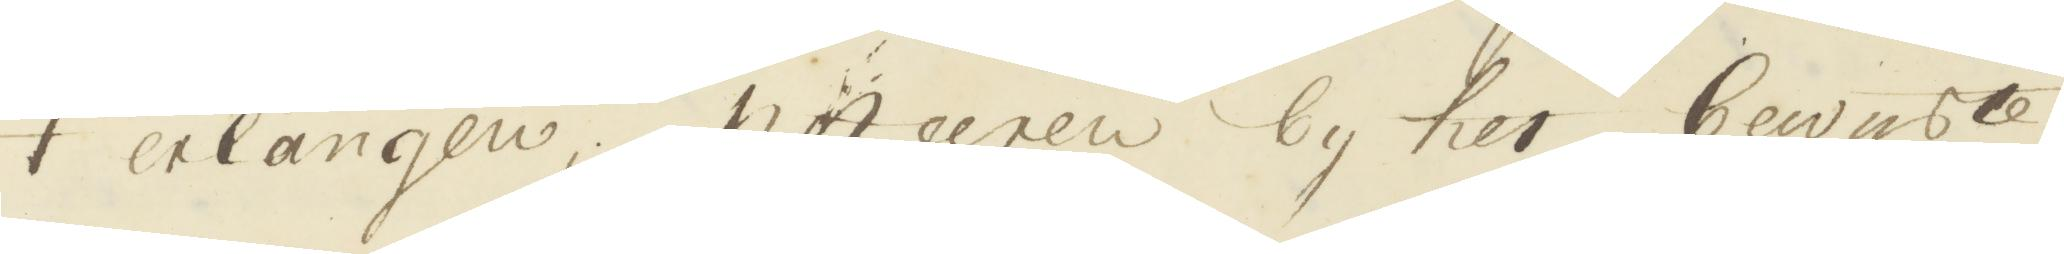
t erlangen noteeren by het bewuste
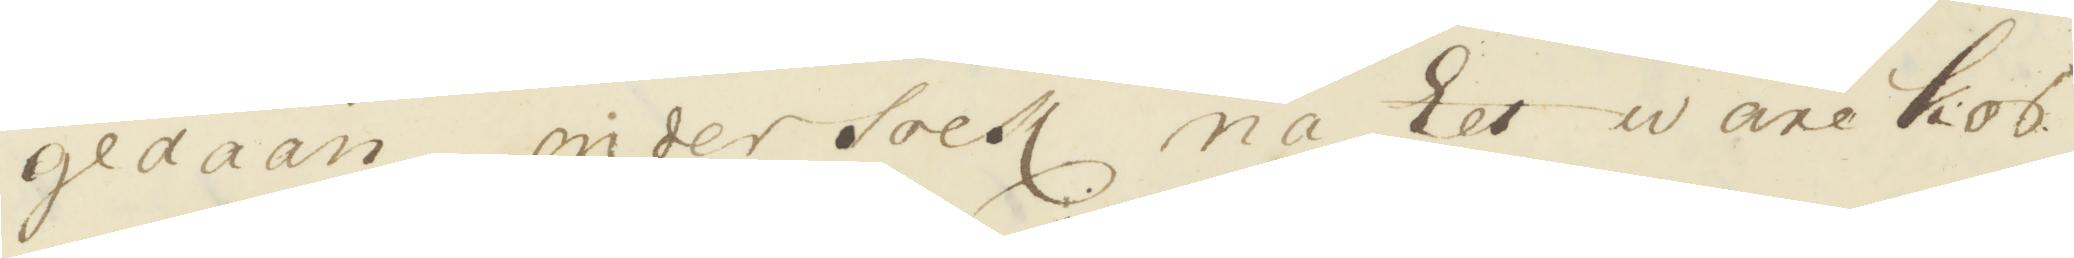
gedaan ondersoek na het ware kos.
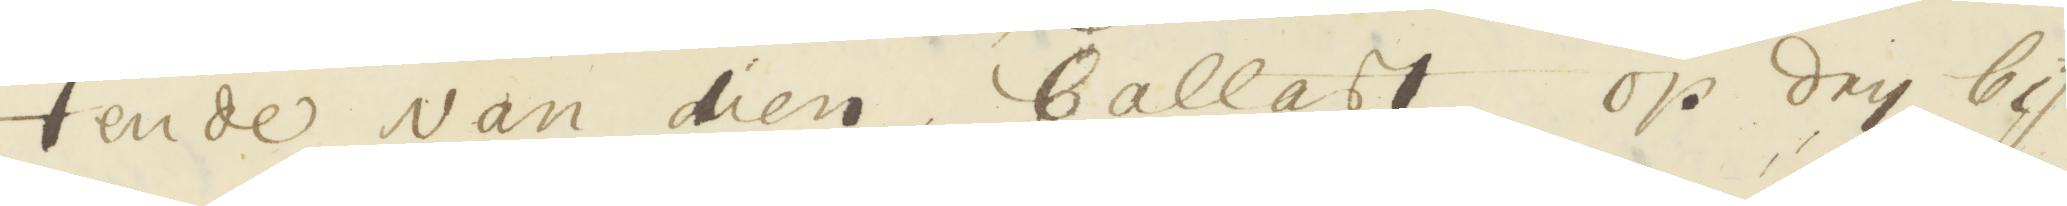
tende van dien, ballast op dry bij
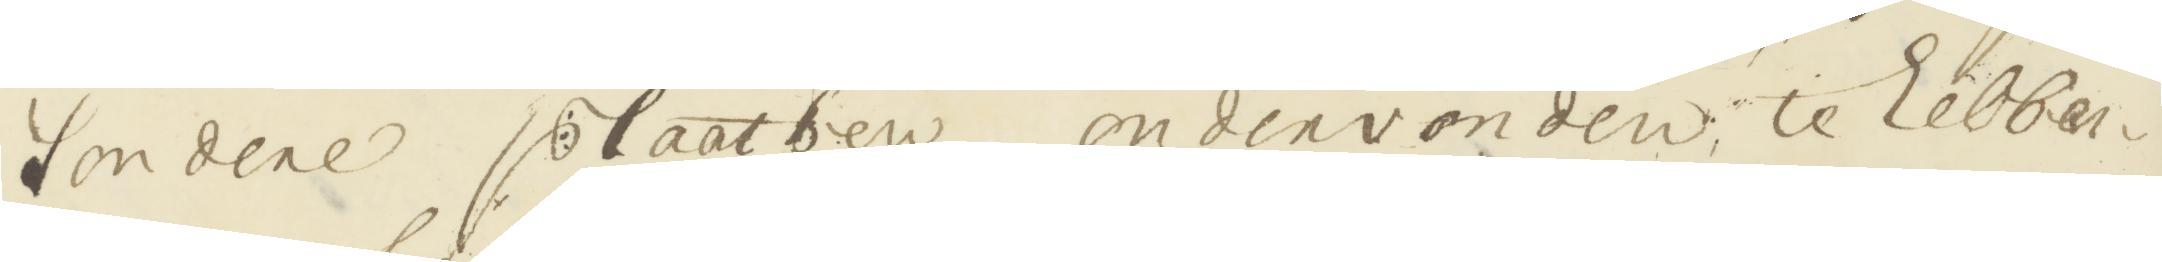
Sondere plaatsen ondervonden; te hebben,
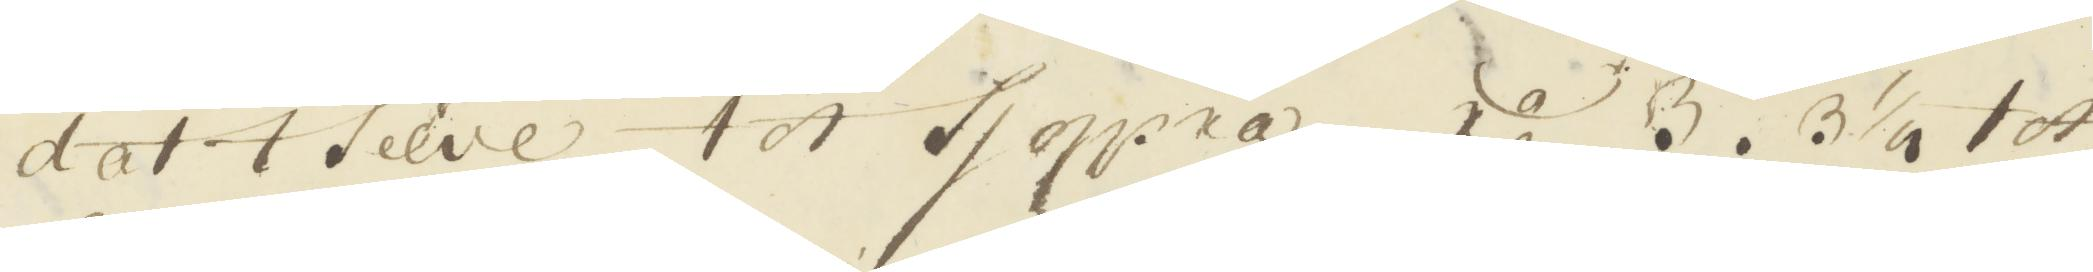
dat 't selve tot SJoppra r:o/a 3. 3¼ tot
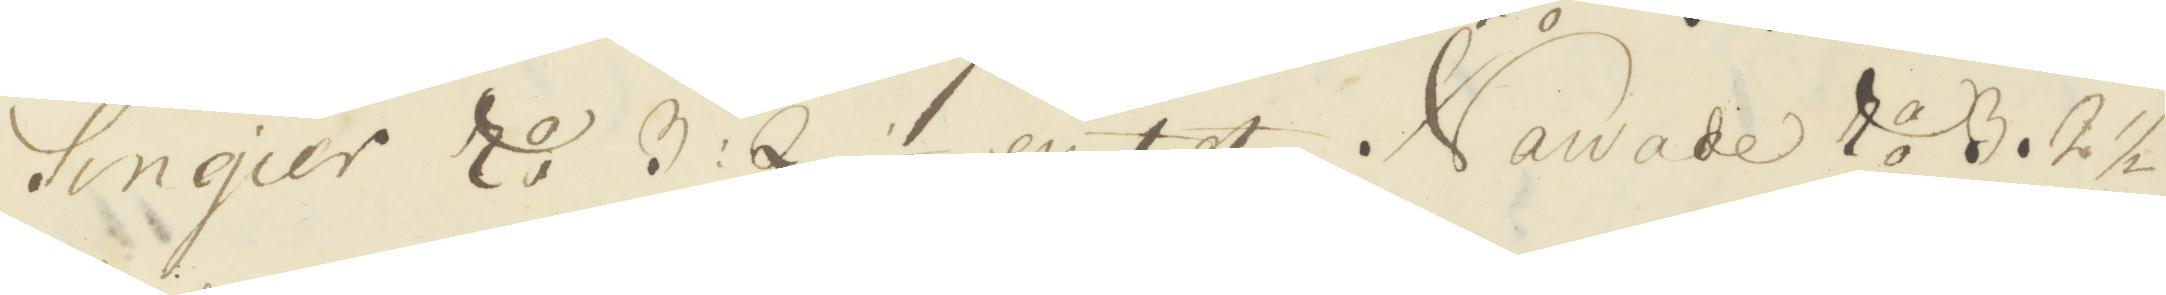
Singier r:o/a 3: 2 :— en tot Nawade r:o/a 3. 2½
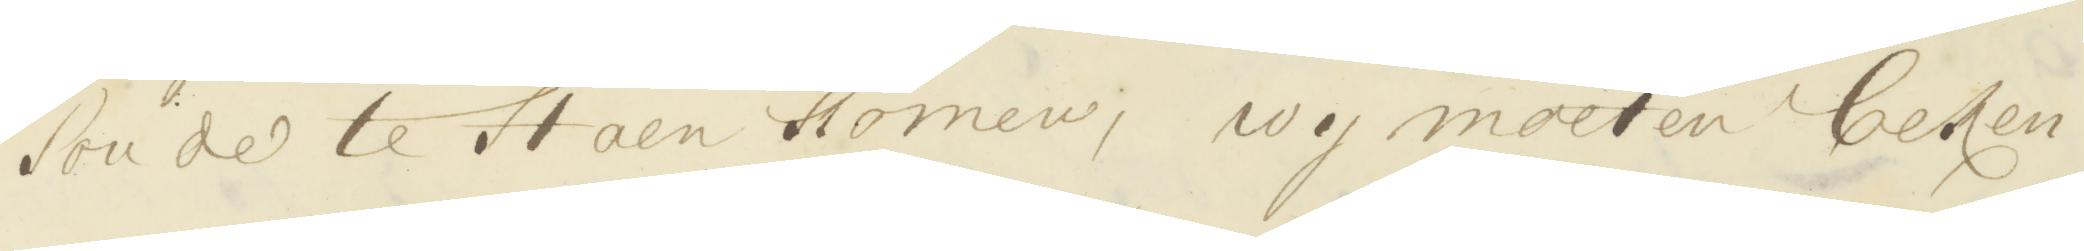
Soude te staen komen; wy moeten beken
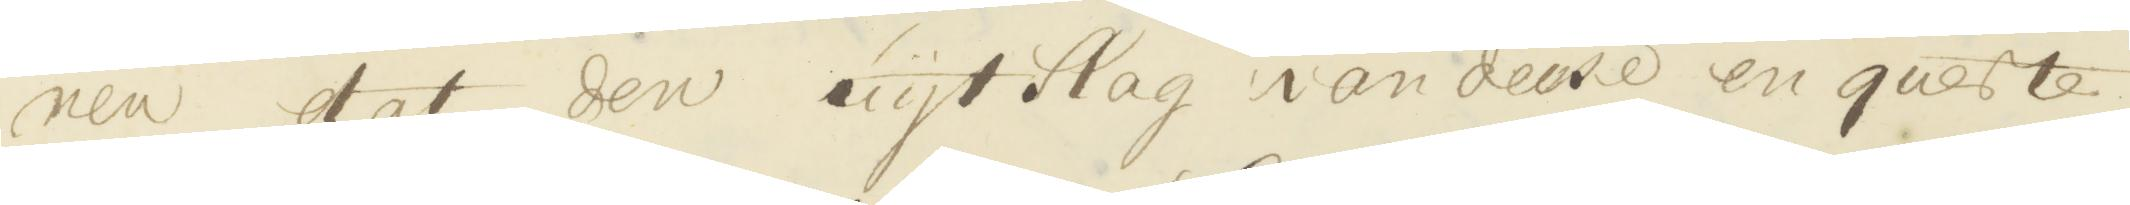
nen dat den uijtslag van deese en queste
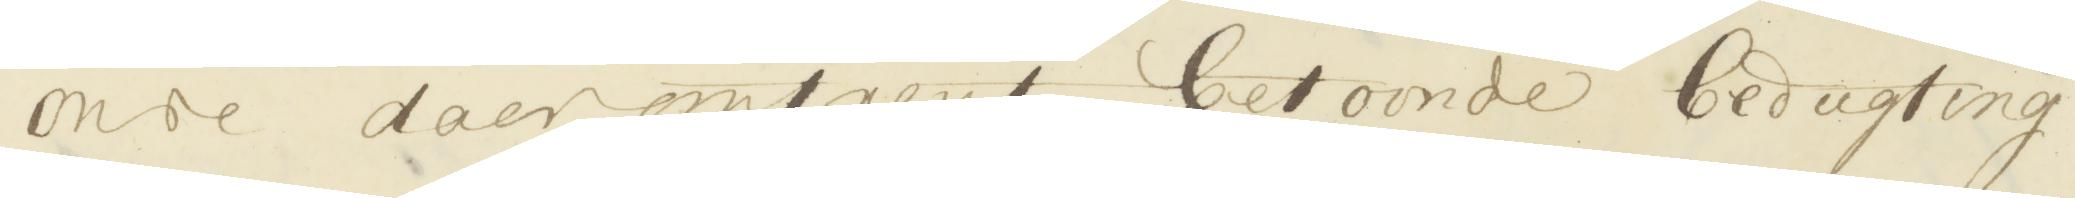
onse daer omtrent betoonde bedugting
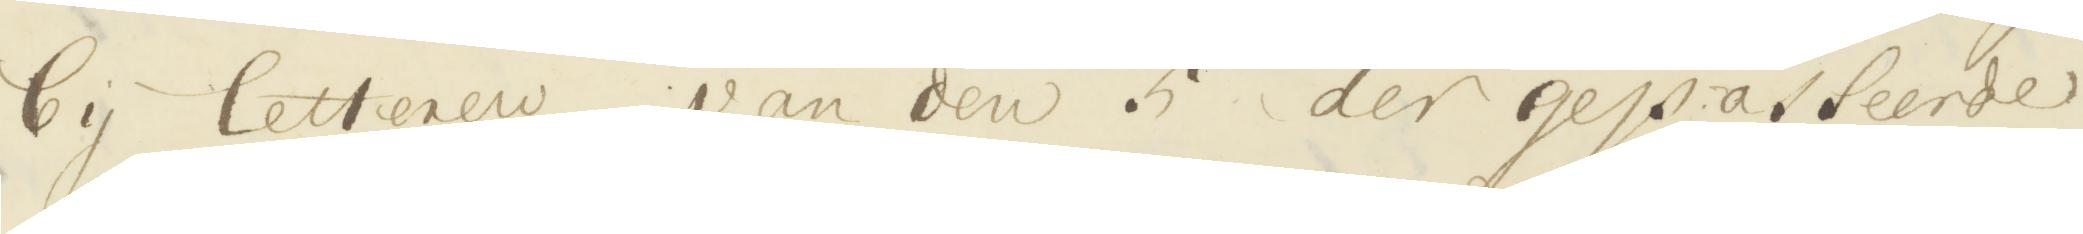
bij letteren van den 5 der gepasseerde
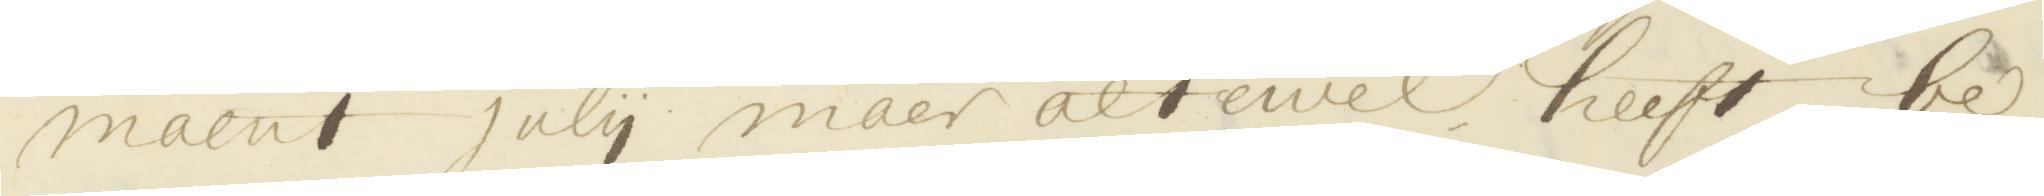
maent julij maer altewel heeft be
